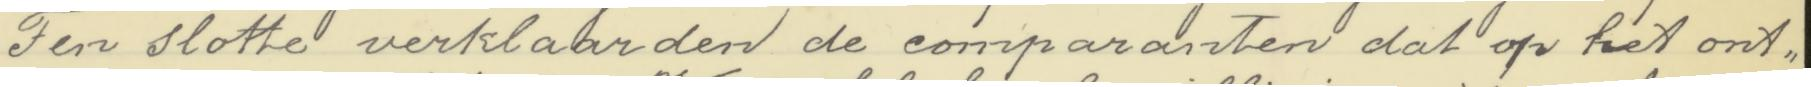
Ten slotte verklaarden de comparanten dat op het ont„
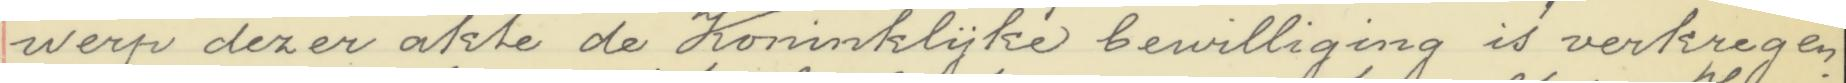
werp dezer akte de Koninklijke bewilliging is verkregen
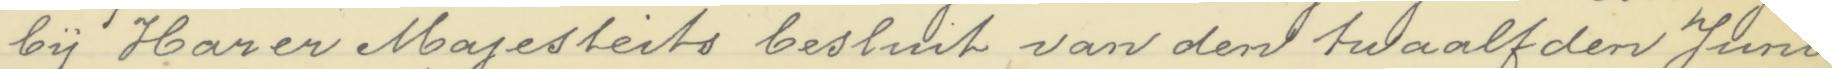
bij Harer Majesteits besluit van den twaalfden Juni
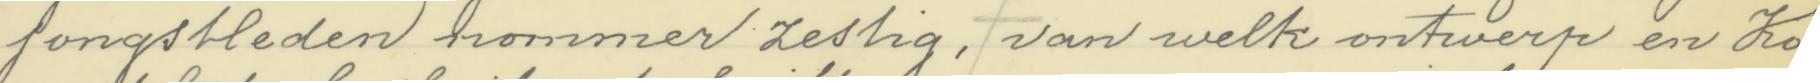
jongstleden nommer zestig, van welk ontwerp en Ko
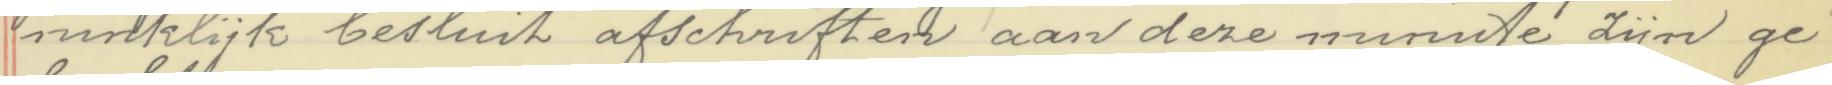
ninklijk besluit afschriften aan deze minute zijn ge
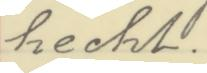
hecht.
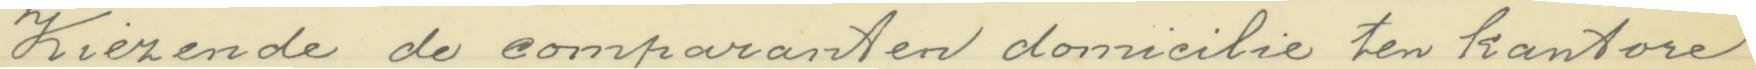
Kiezende de comparanten domicilie ten kantore
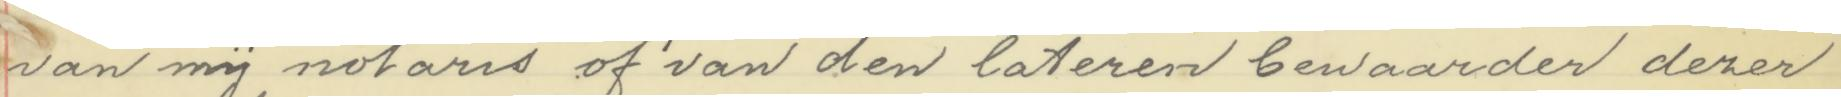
van mij notaris of van den lateren bewaarder dezer
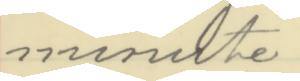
minute
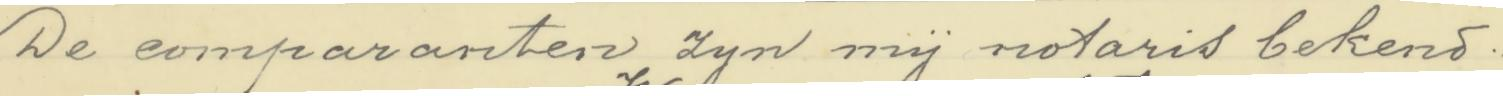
De comparanten zyn mij notaris bekend
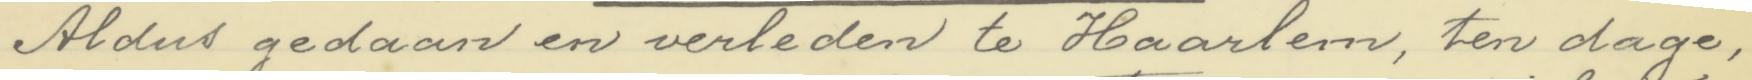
Aldus gedaan en verleden te Haarlem, ten dage,
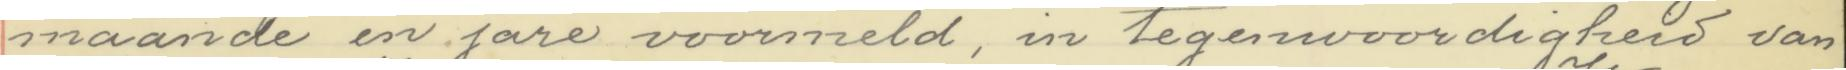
maande en jare voormeld, in tegenwoordigheid van
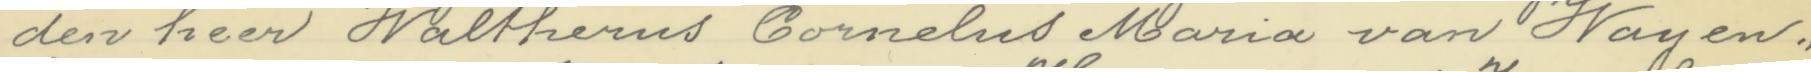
den heer Waltherus Cornelus Maria van Wayen„
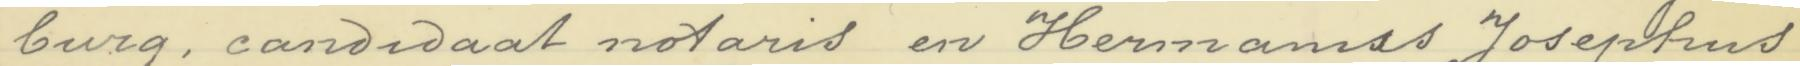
burg, candidaat notaris en Hermanus Josephus
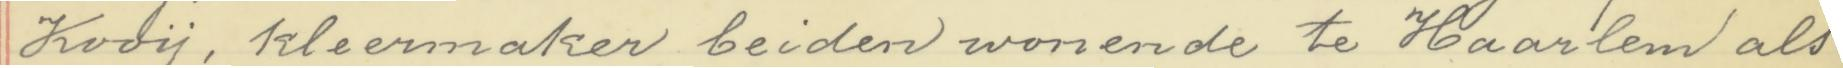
Kooij, kleermaker beiden wonende te Haarlem als
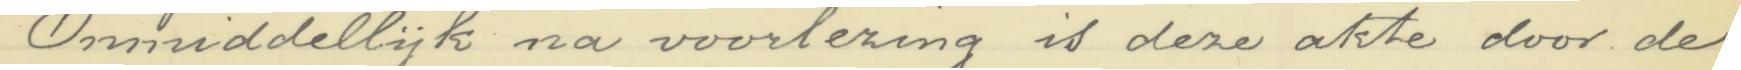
Onmiddellijk na voorlezing is deze akte door de
